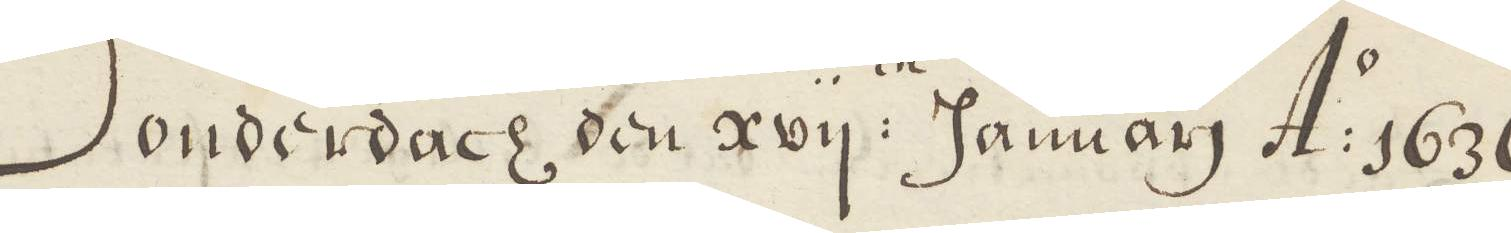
Donderdach den xvij:en Januarj A:o 1636
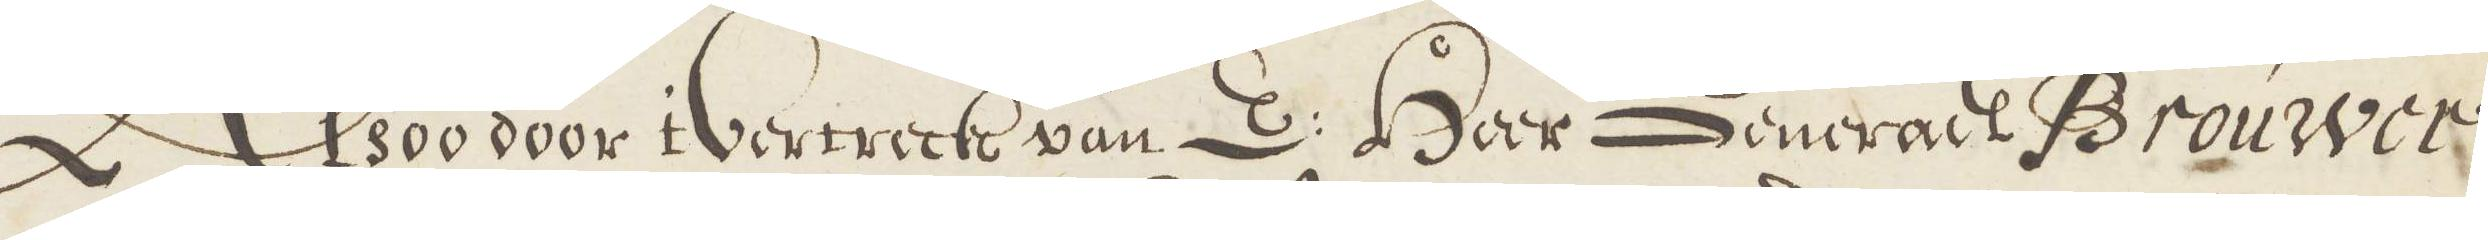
Alsoo door 't vertreck van E: Heer Generael Brouwer
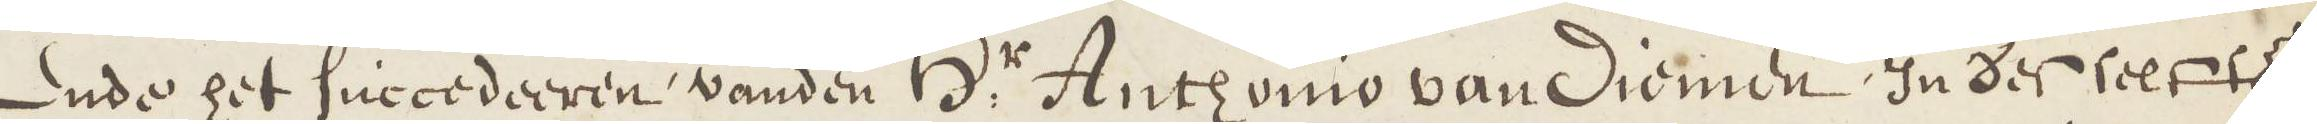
Ende het succedeeren van den H:r Authonio van Diemen, In desselffs.
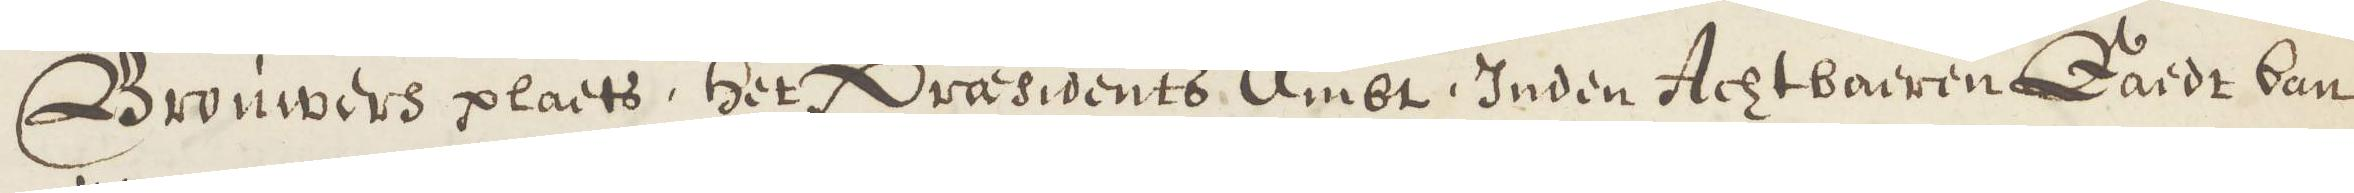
Brouwers plaets, het Praesidents ambt, Inden Achtbaeren Raedt van
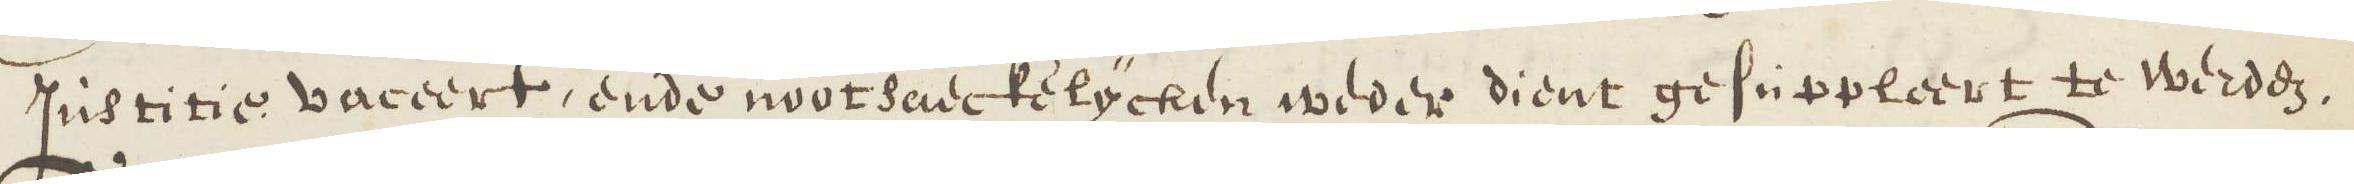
Justitie vaceert, ende nootsaeckelijcken weder dient gesuppleert te werden.
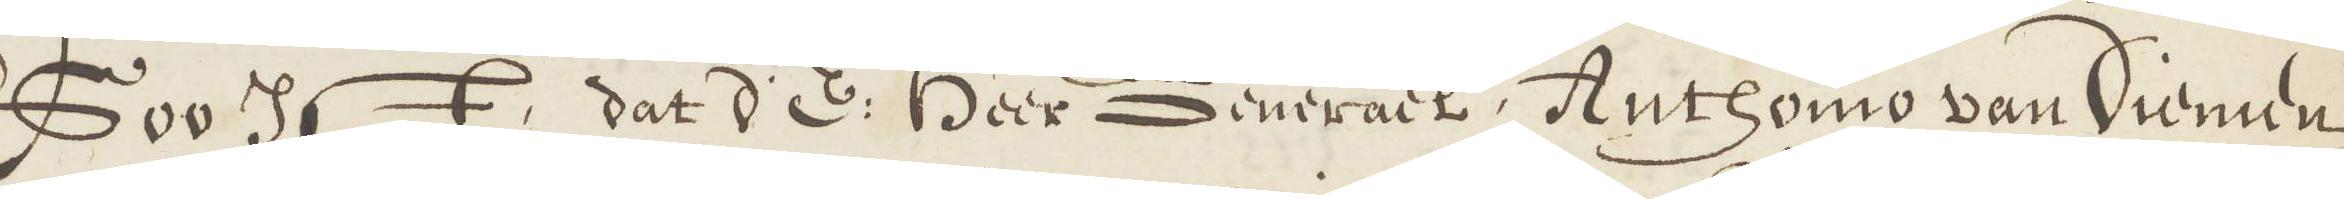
Soo Ist, dat d’ E: Heer Generael, Anthonio van Diemen
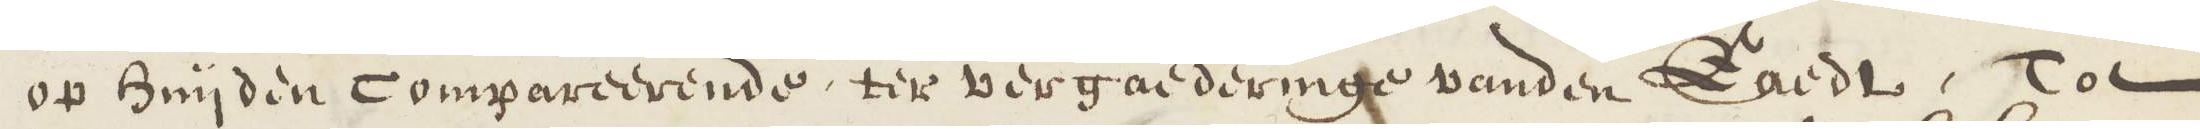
op huijden compareerende, ter vergaederinge vanden Raedt, tot
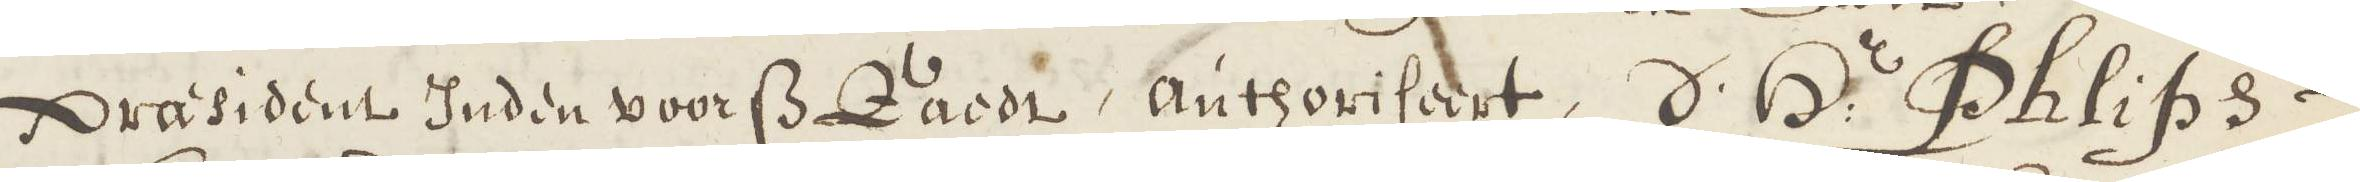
Praesident Inden voorsz Raedt, authoriseert, d H:r Philips ‒
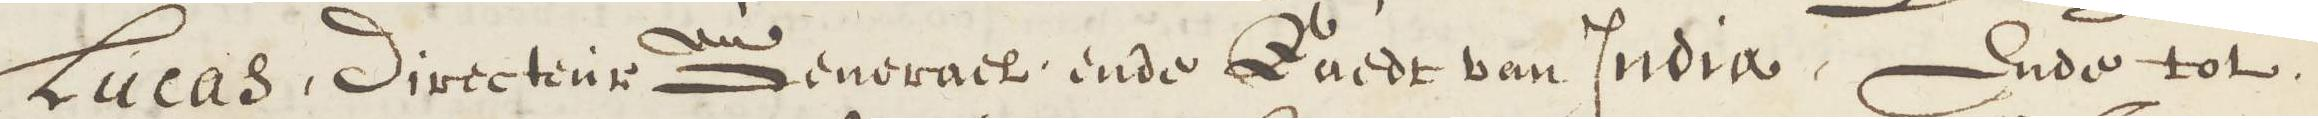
Lucas, Directeur Generael ende Raedt van Jndia, Ende tot
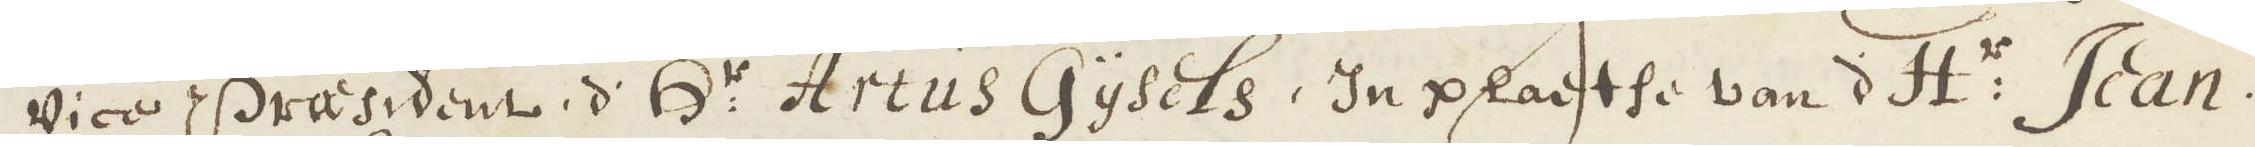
vice Praesident, d’ h:r Artus Gijsels, In plaetse van d’ H:r Jean
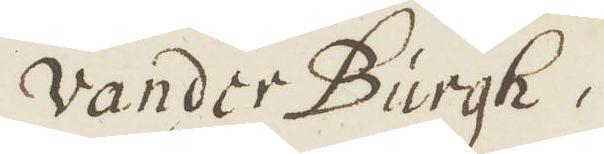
van der Burgh,
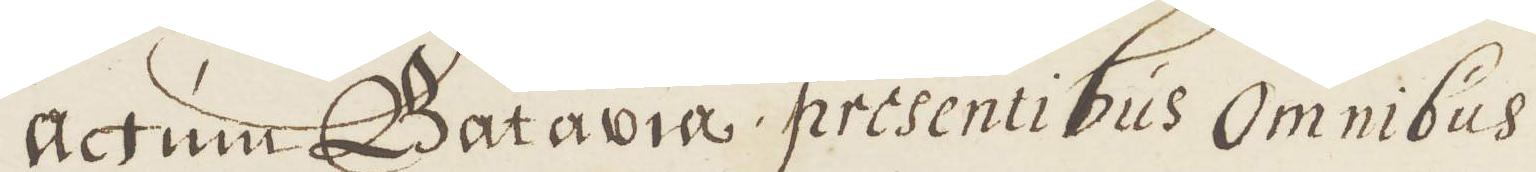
actum Batavia. presentibus Omnibus
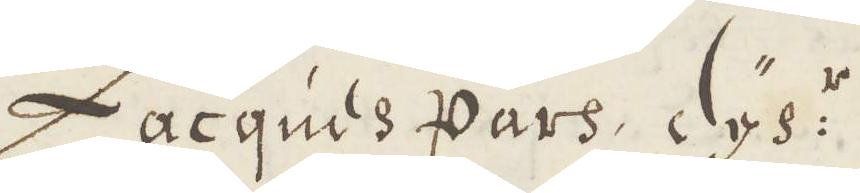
Jacques pars, eijs:r
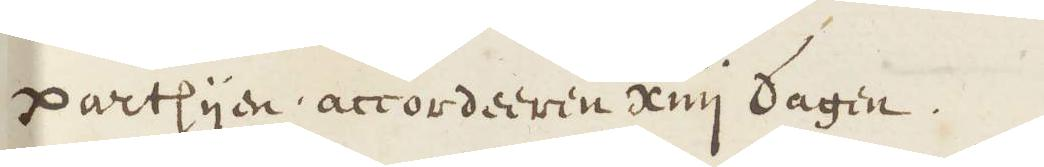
partijen accordeeren xiiij dagen.
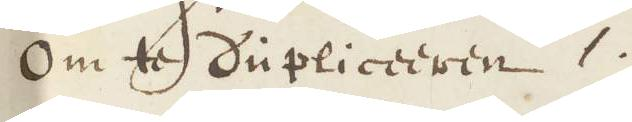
om te dupliceeren /
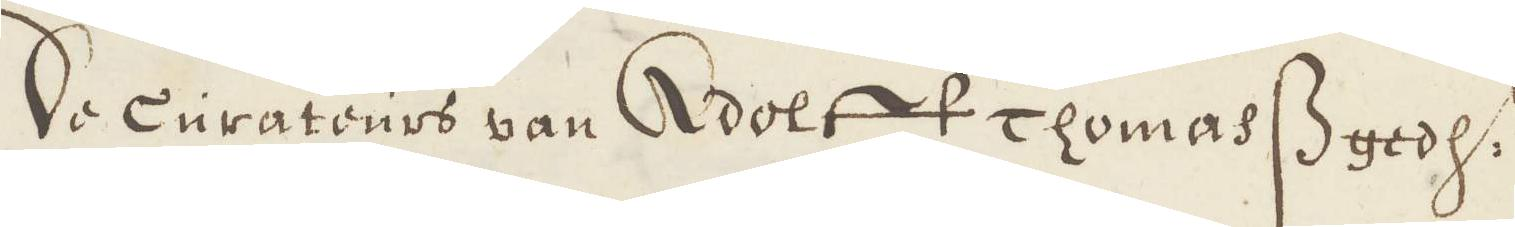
De curateurs van Adolff Thomassz gedh:ns
